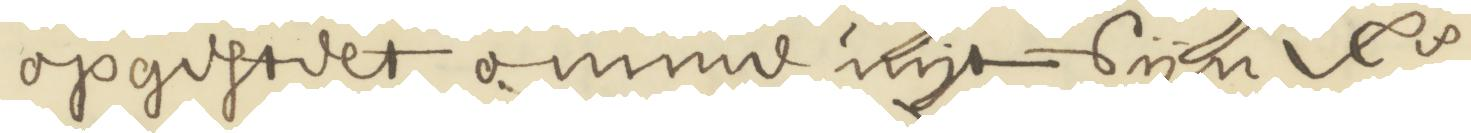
opgestelt omme uijt sijn E„s
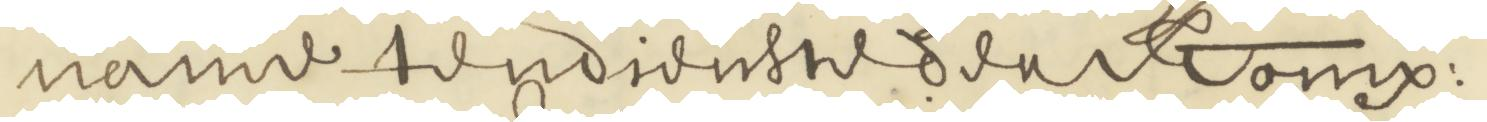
name ten dienste der E Comp:
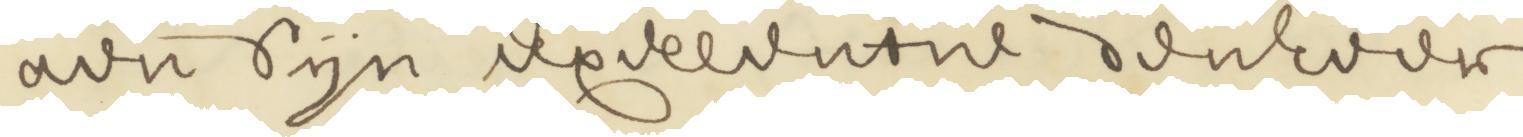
aen sijn exellentie denheer
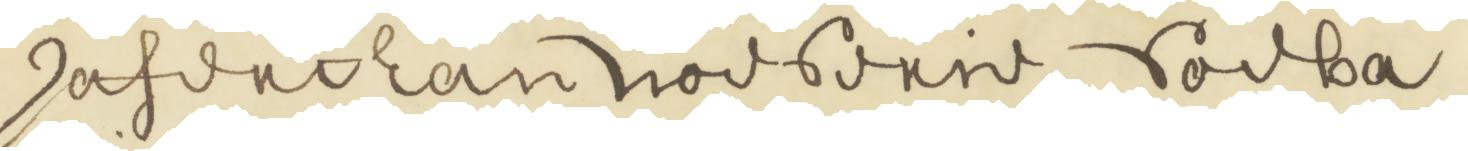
Jaferchan noeserie soeba
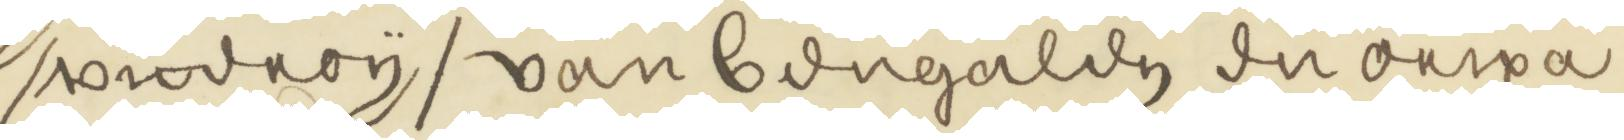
/viceroij / van bengalen en oripa
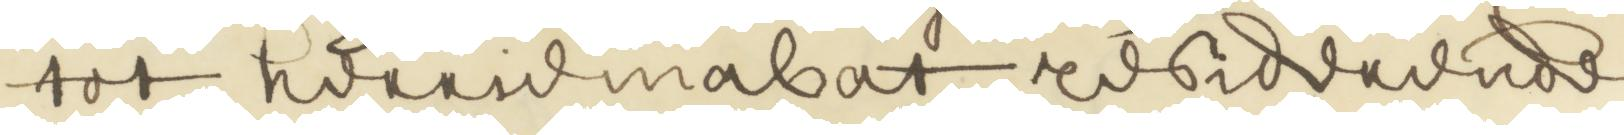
tot kerriemabat residerende
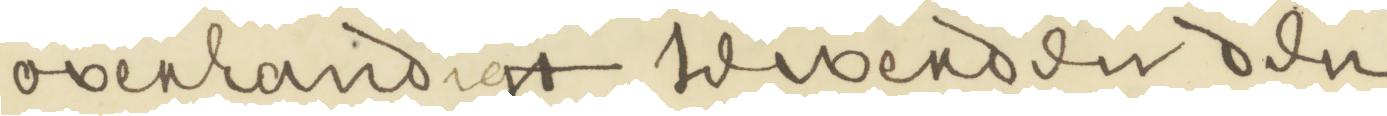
overhandigt te werden den
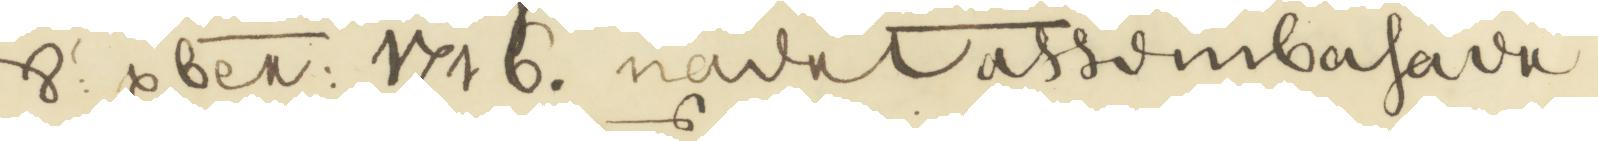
8:' xber: 1716. naer Cassembasaer
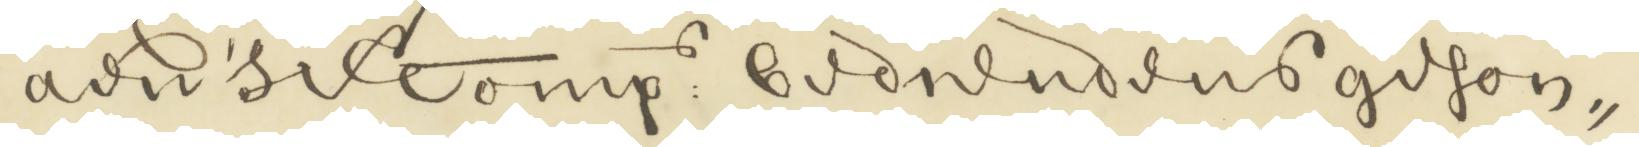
aen ’s E Comp:s bediendens geson„
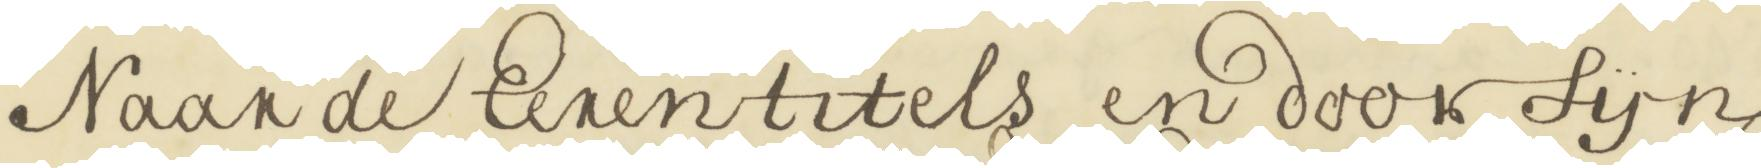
Naar de Eerentitels en door sijn
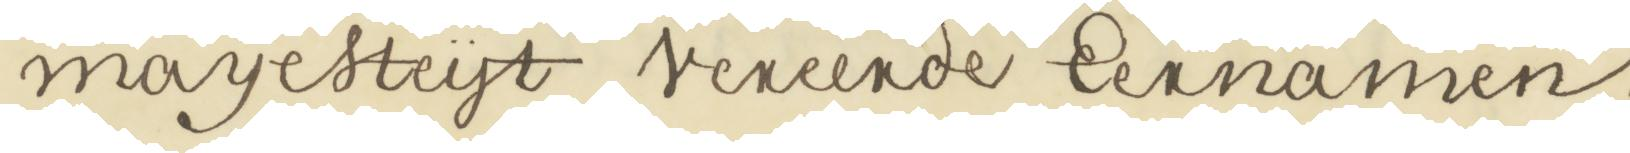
maijesteijt vereerde Eernamen.
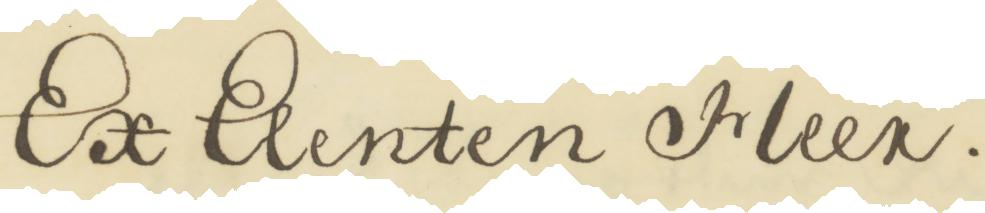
Ex Elenten Heer.
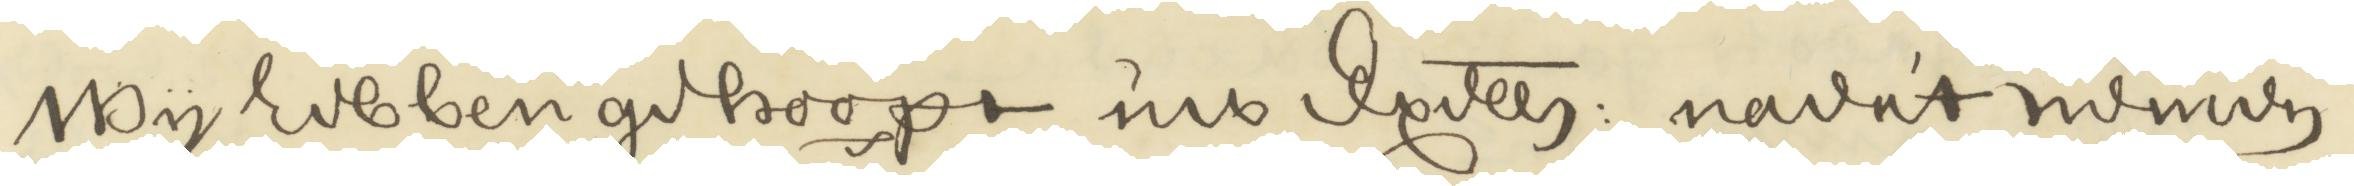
Wij hebben gehoopt uw Exell: naer't nemen
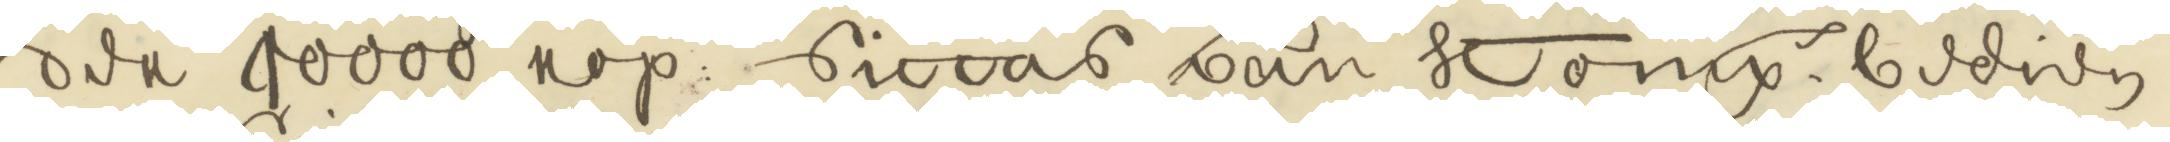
der 40000 rop:s siccas van sComp.s bedien
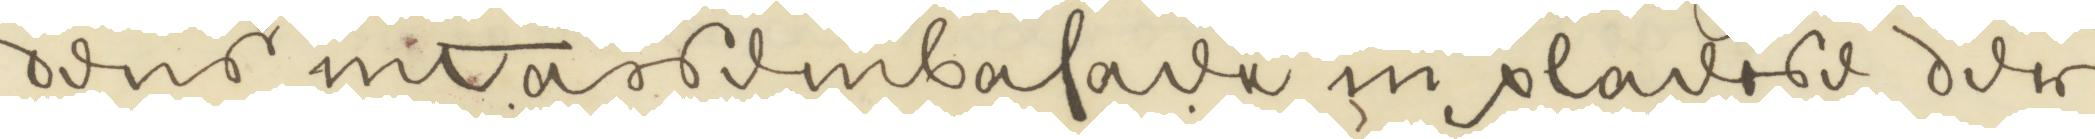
dens in Cassembasaer in plaetse der
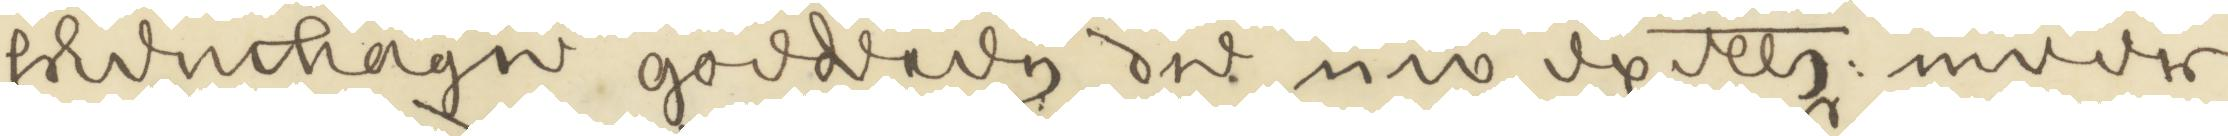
schenckagie goederen die uw exell: meer
